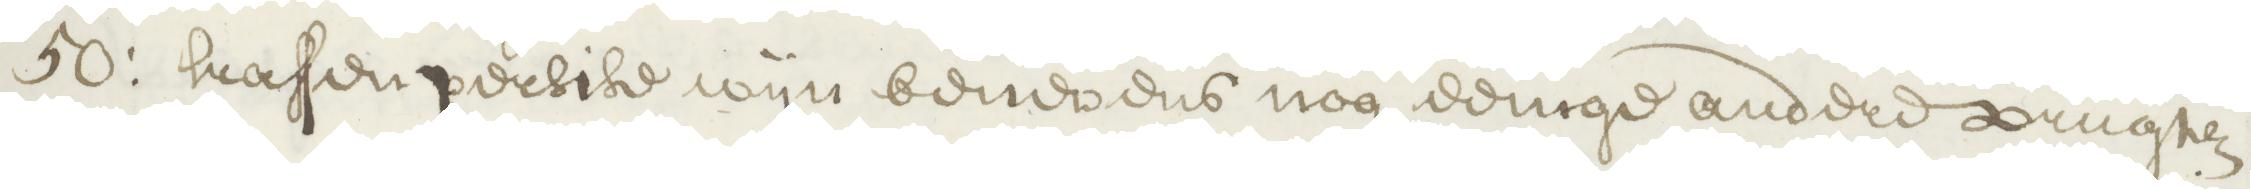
50: kassen persise wijn benevens nog eenige andere vrugten
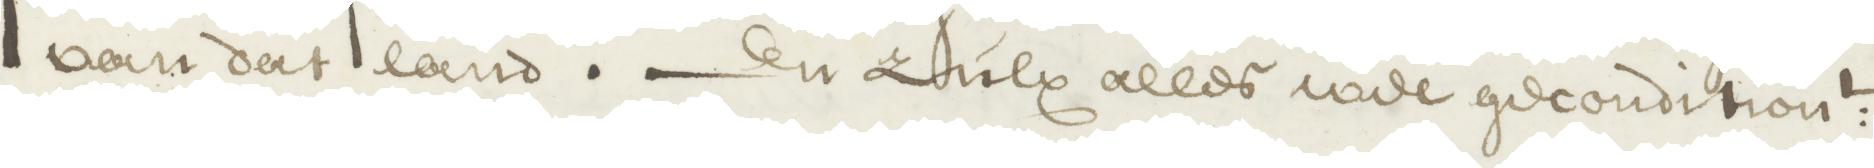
van dat land. En zulx alles wel geconditiont
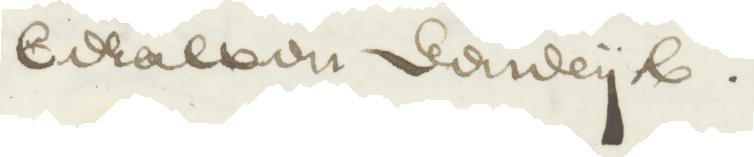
behalven Eenelijk.
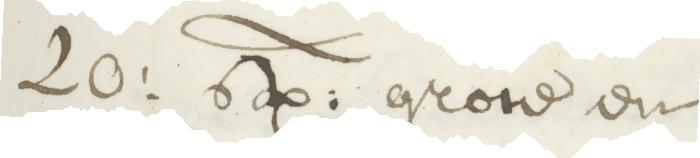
20: sx: grote en
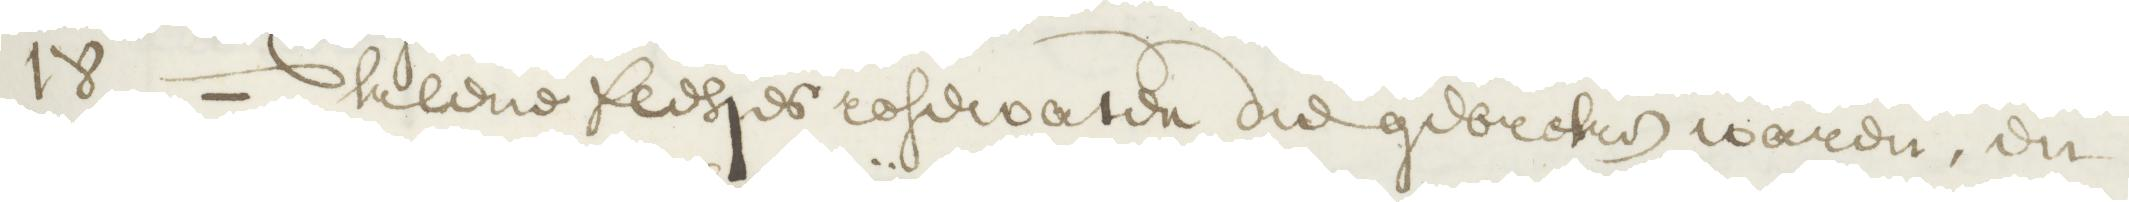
18 — klene flesjes rosewater die gebroken waren, en
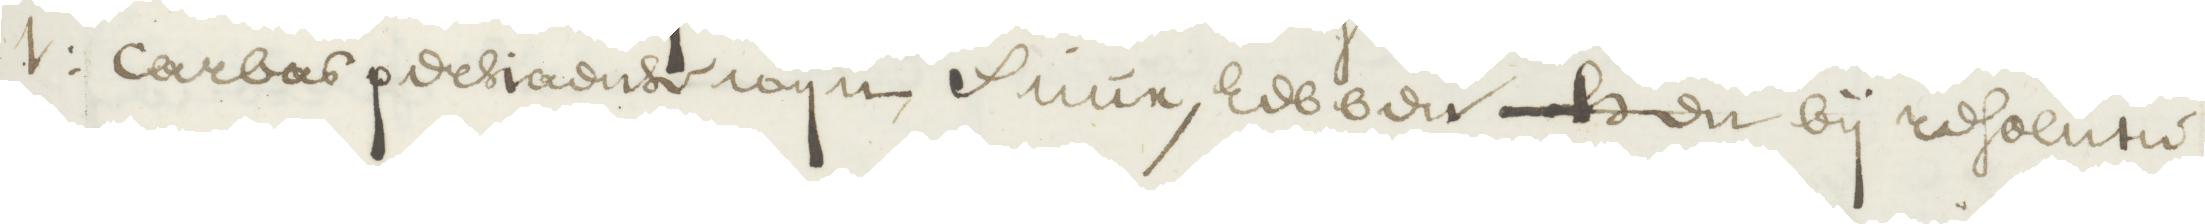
1: carbas persiaense wijn, suur, hebben hen bij resolutie
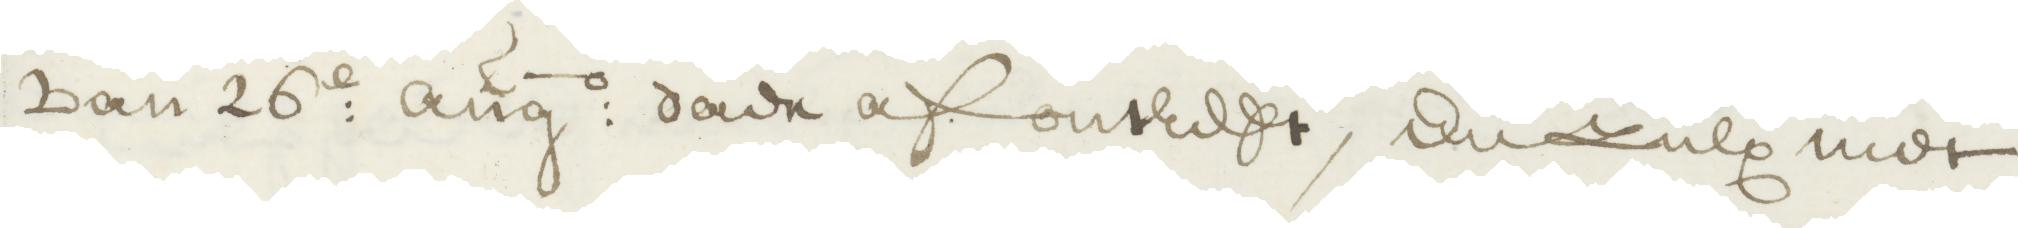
van 26:e aug:o daer af ontheft, En zulx niet
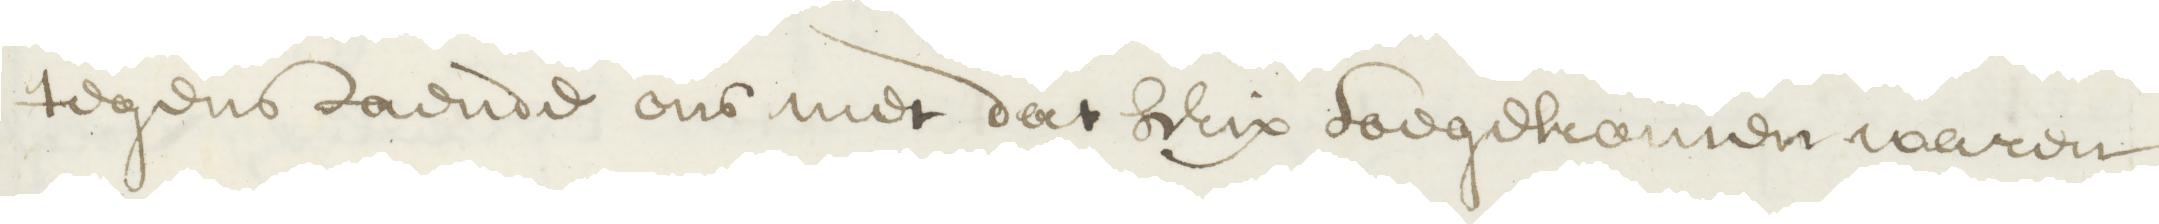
tegenstaende ons met dat schip toegekomen waren
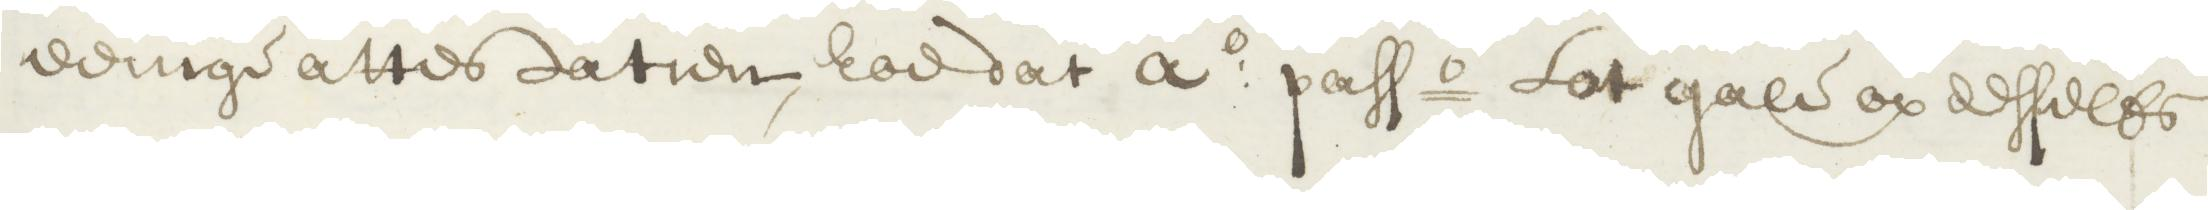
eenige attestatien, hoe dat a:o pass=o tot gale op desselfs
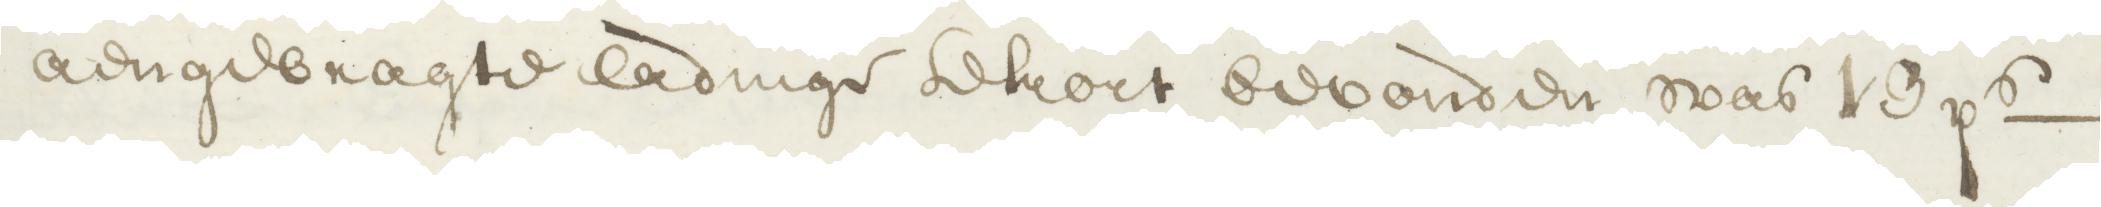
aengebragte ladinge tekort bevonden was 13 p_s
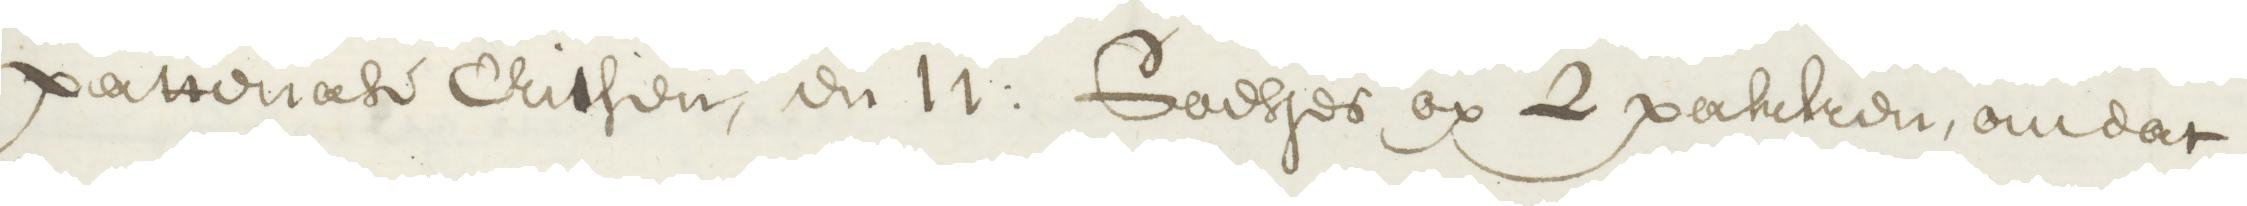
pattenase Chitsen, en 11: Soesjes op 2 pakken, omdat
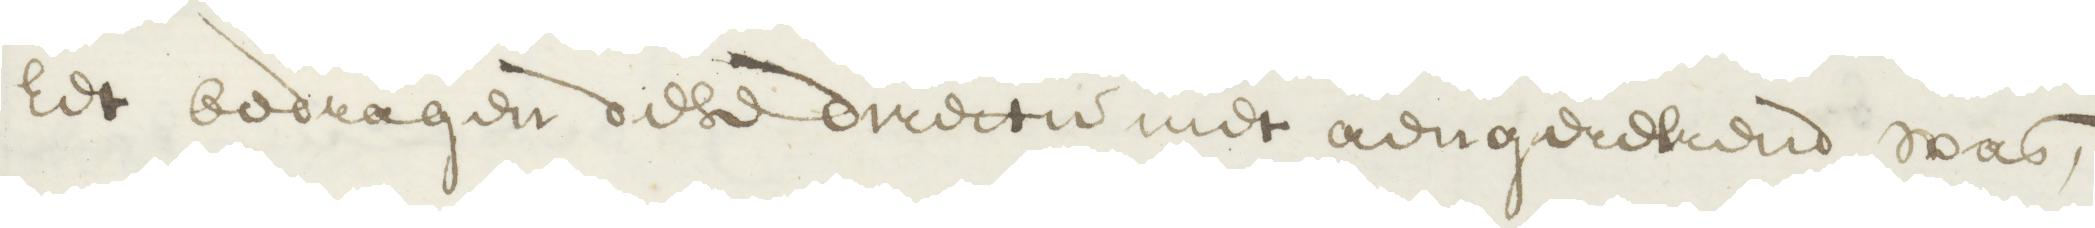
het bedragen dese directie niet aengerekend was,
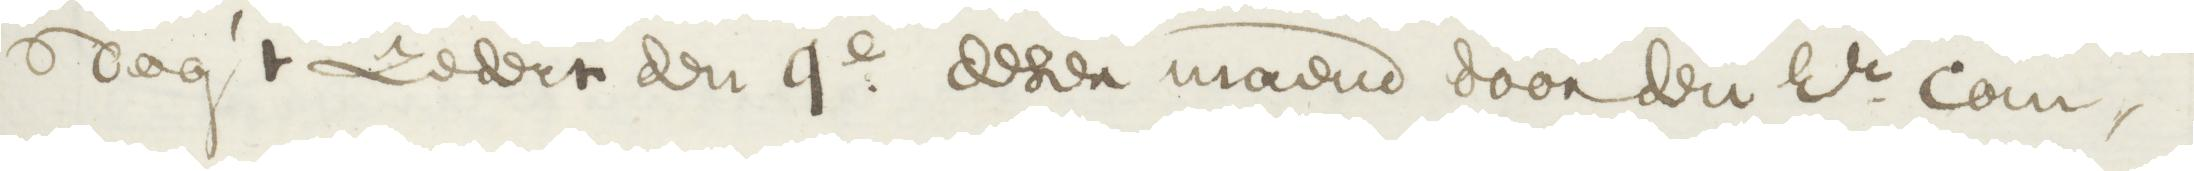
dog ’t zedert den 4:e deser maend door den h.r com„
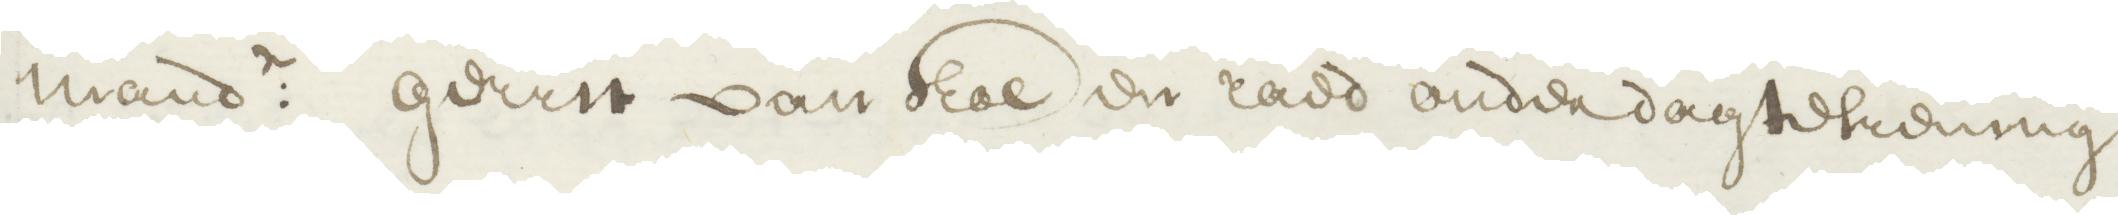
mand:r gerrit van thol en raed onder dagtekening
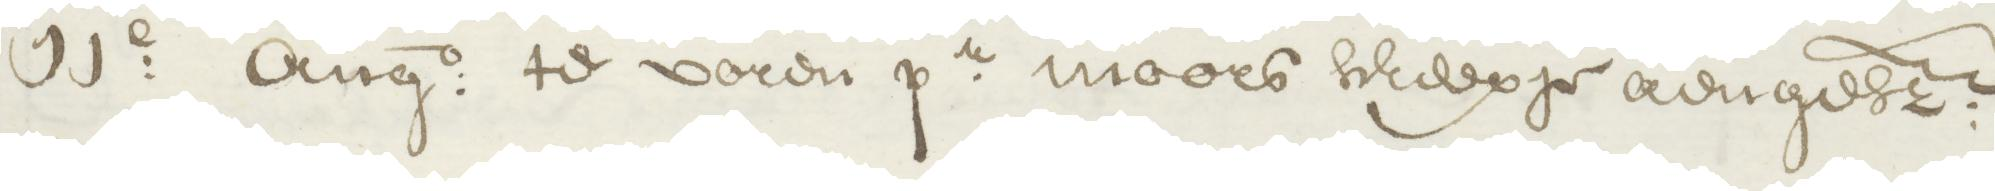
11:e Aug:o te voren p.r moors scheepje aengesz:
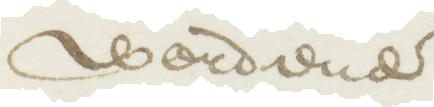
wordende
